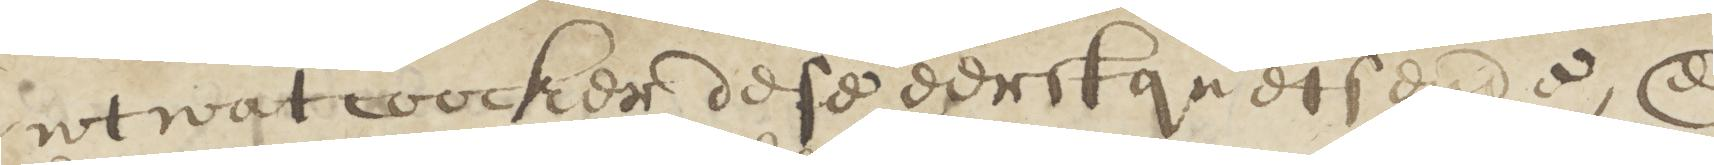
iet wat coocker dese eerstquetsende ende
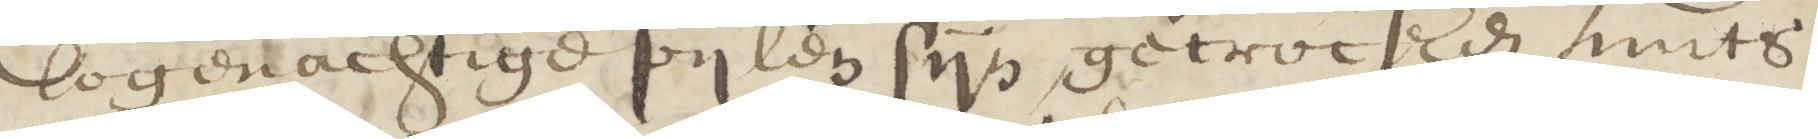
logenachtige pijlen sijn getrocken mits
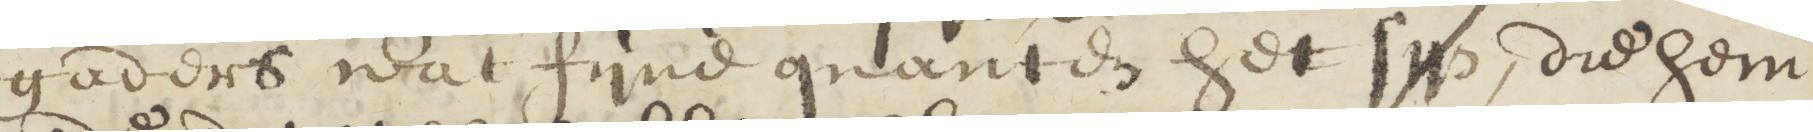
gaders wat fijne quanten het sijn, die hem
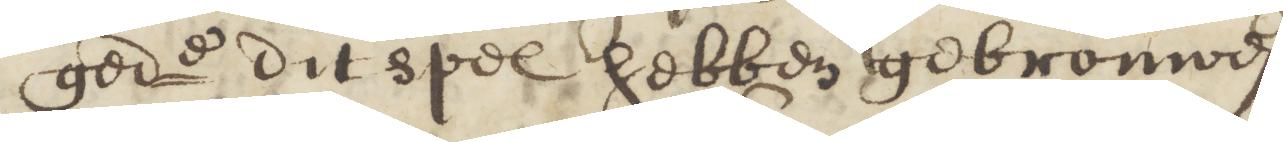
ged=e dit spel hebben gebrouwen
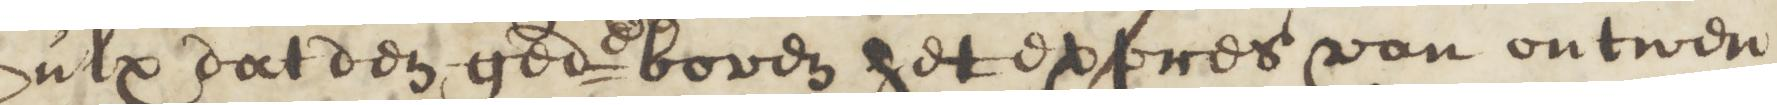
Sulx dat den ged=e boven het expres van ontwen
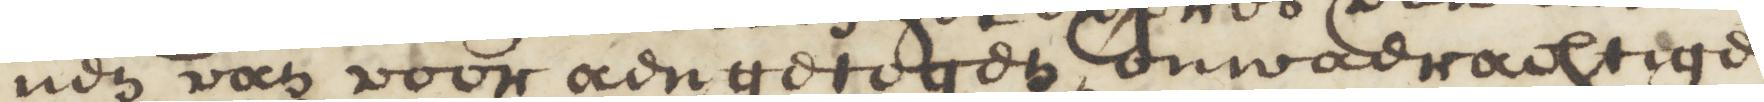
nen van voor aen getogen omwaerachtige
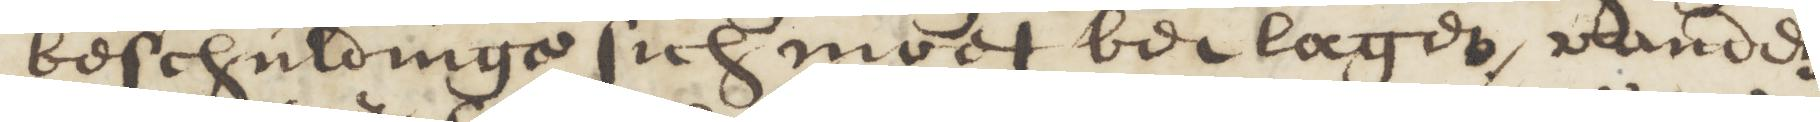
beschuldinge sich moet beclagen, van den
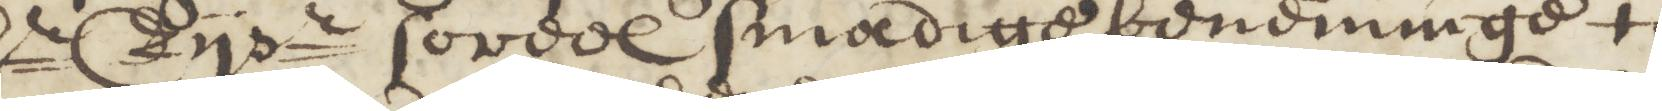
H=r Eijs=r soveel smadige beneminge te
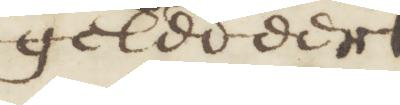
geleddert
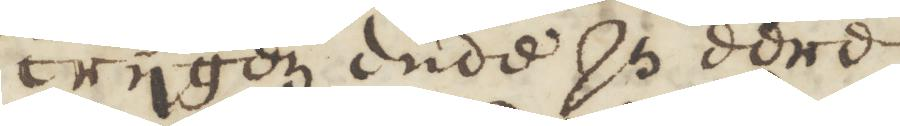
crijgen ende jn dere
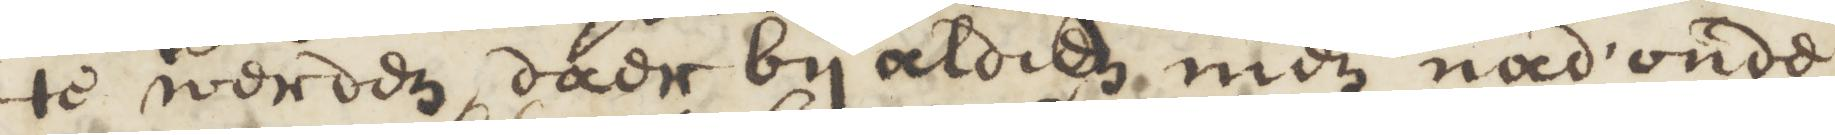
te werden daer bij aldien, men nad'oude
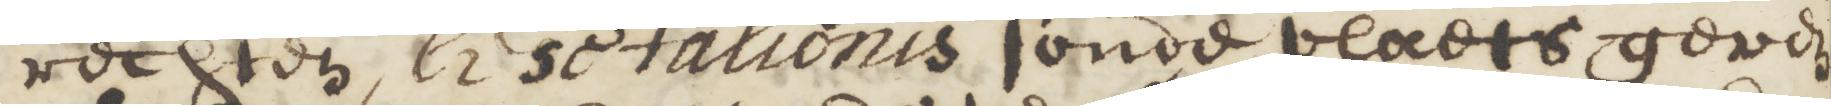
rechten lise talionis soude plaets geven
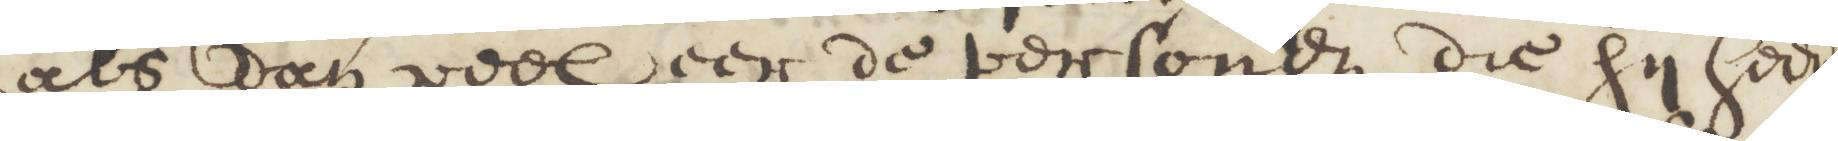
als dan veel eer de personen die hij heer
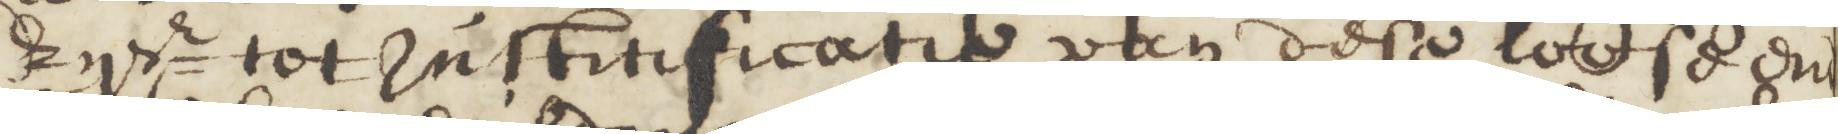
Eijs=r tot Justitificatie van dese loose en
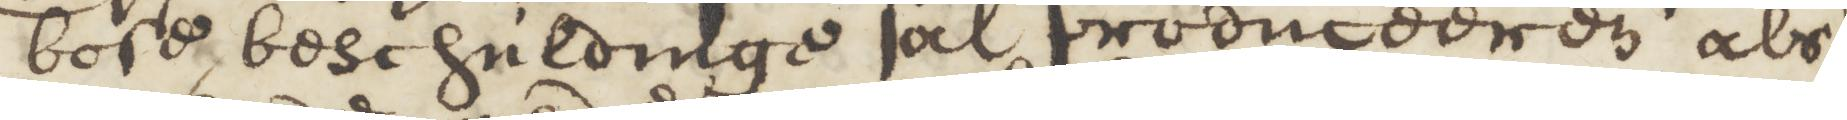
bose beschuldinge sal produceeren als
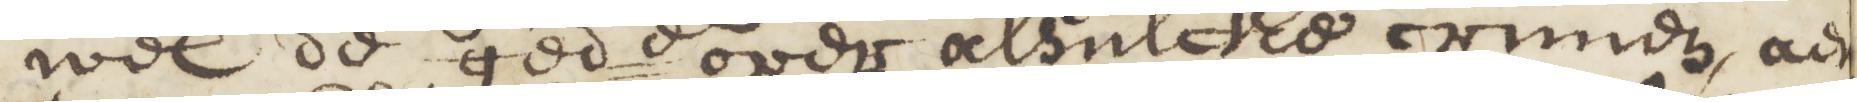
wel de ged=e over alsulcke crimen, aen
